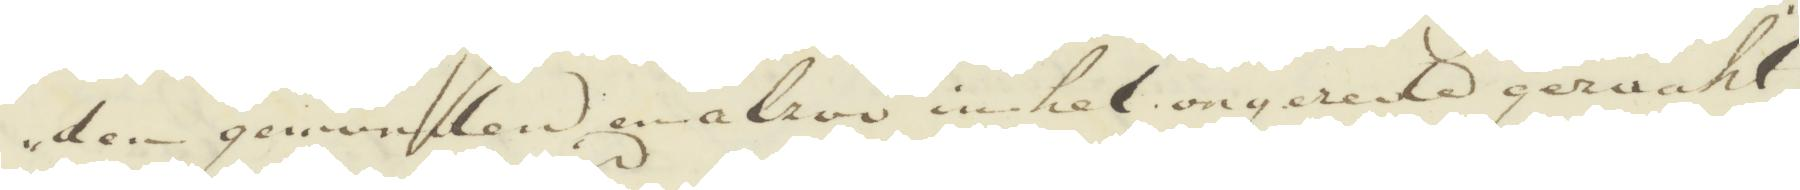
„den geworden, en alzoo in het ongerede geraakt
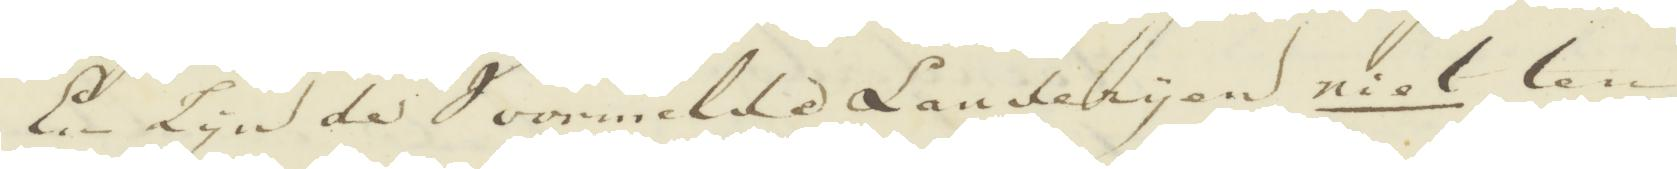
En zijn de Voormelde Landerijen niet ten
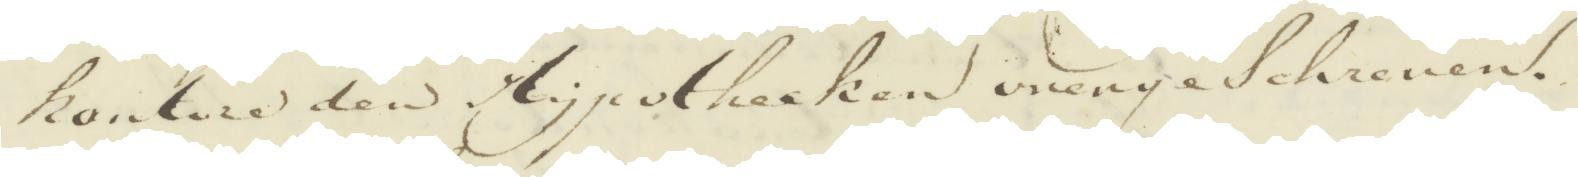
kantore der Hijpotheeken overgeschreven.
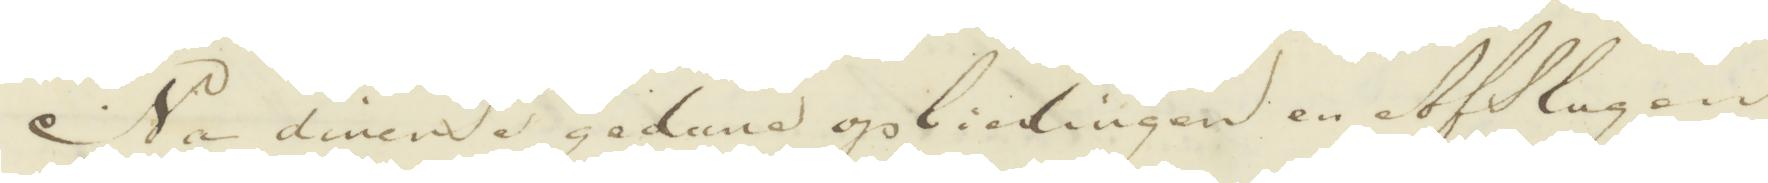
Na diverse gedane opbiedingen en Afslagen
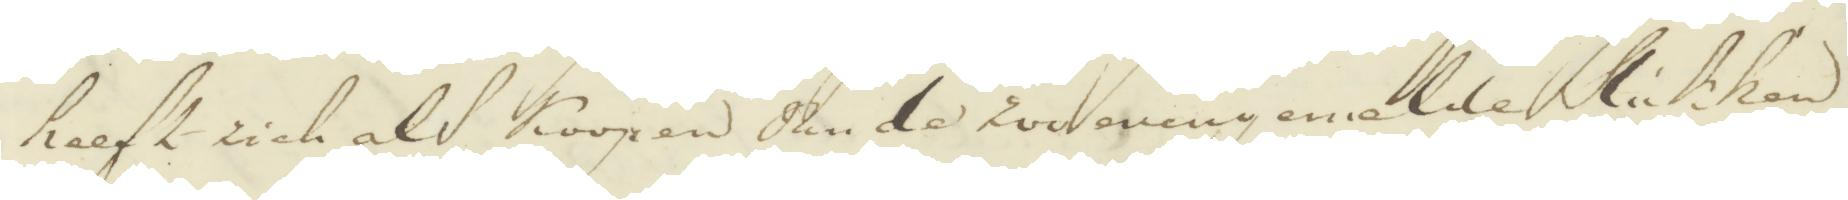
heeft zich als Kooper van de zoo evengemelde stukken
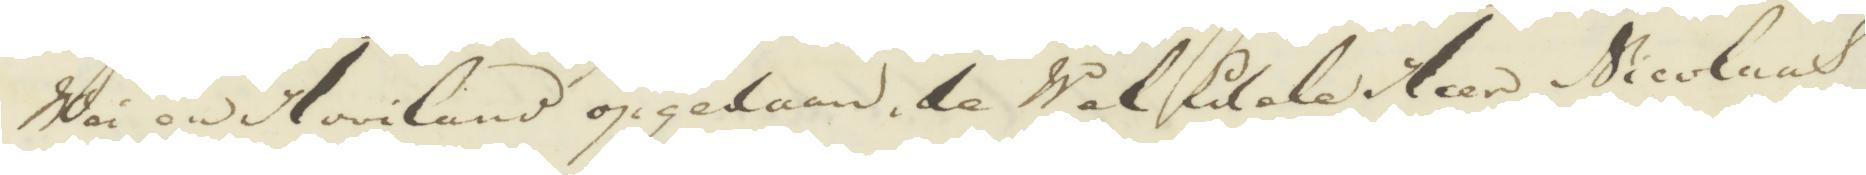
Wei en Hooiland opgedaan, de Wel Edele Heer Nicolaas
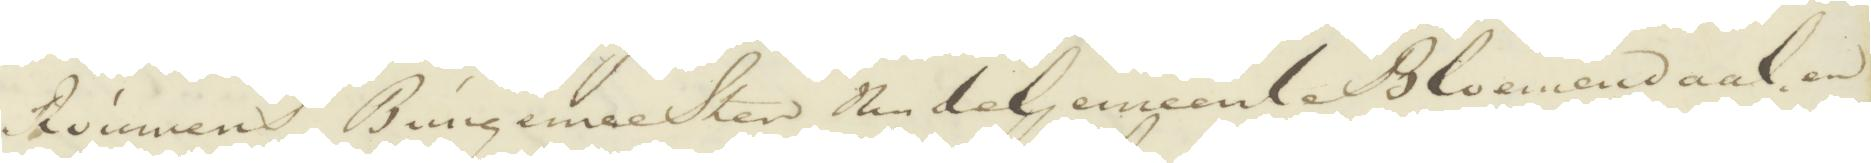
Rouwens, Burgemeester van de Gemeente Bloemendaal, en
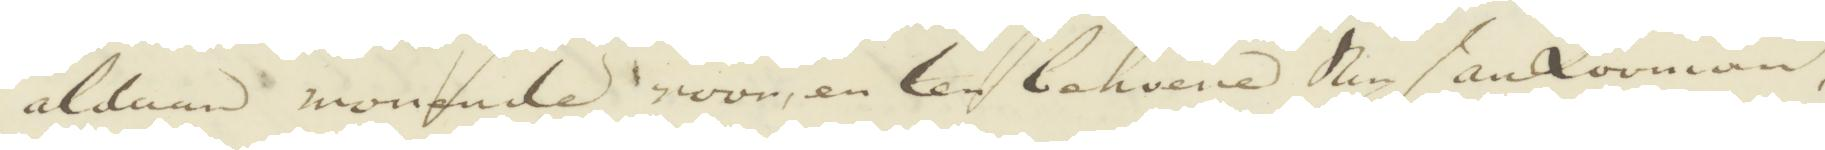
aldaar wonende voor, en ten behoeve van Jan Looman
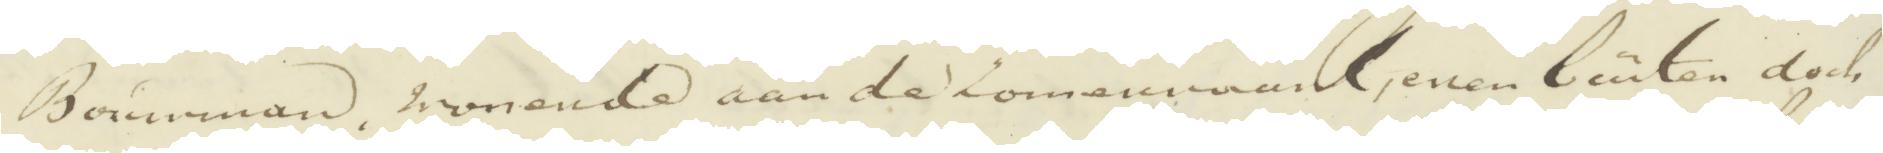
Bouwman, wonende aan de zomervaart, even buiten doch
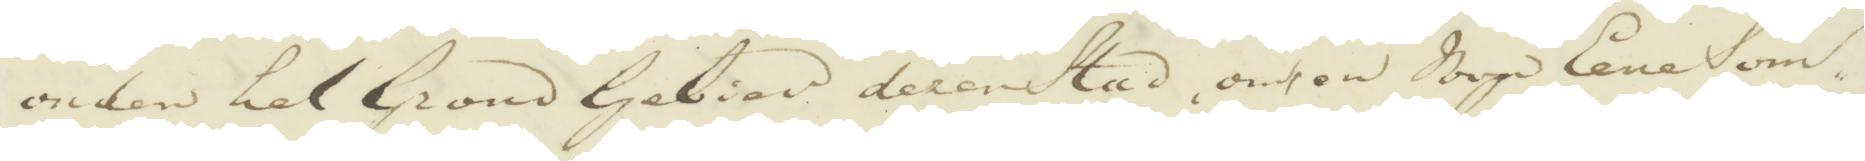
onder het Grond Gebied dezer Stad, om, en voor Eene Som„
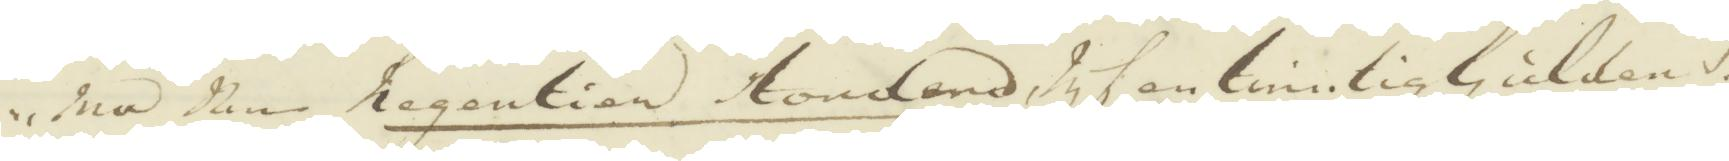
„ma van Negentien Honderd, vijf en twintig Guldens.
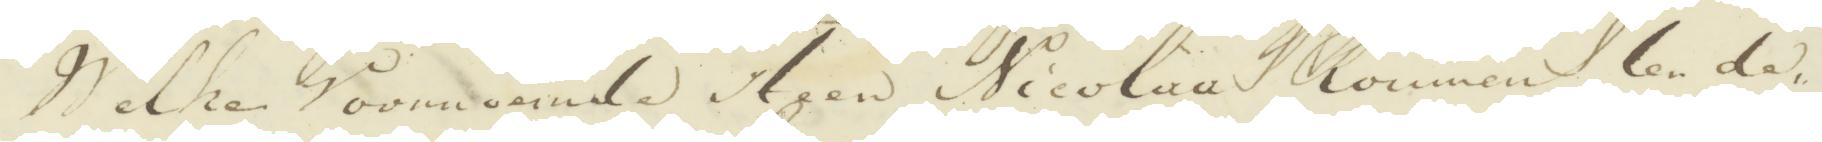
Welke Voornoemde Heer Nicolaas Rouwens ten de„
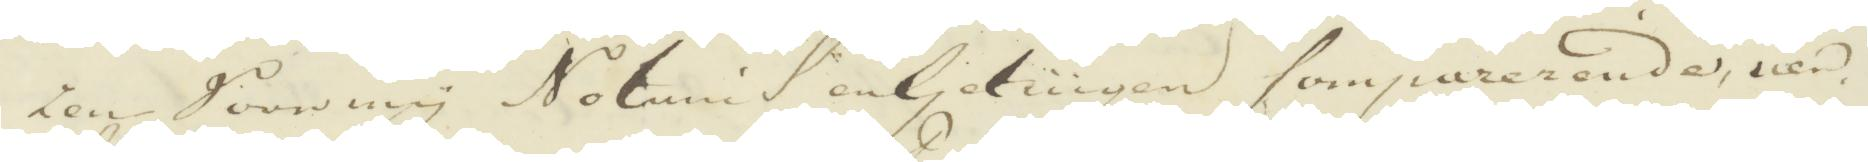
zen Voor mij Notaris en Getuigen Comparerende, ver„
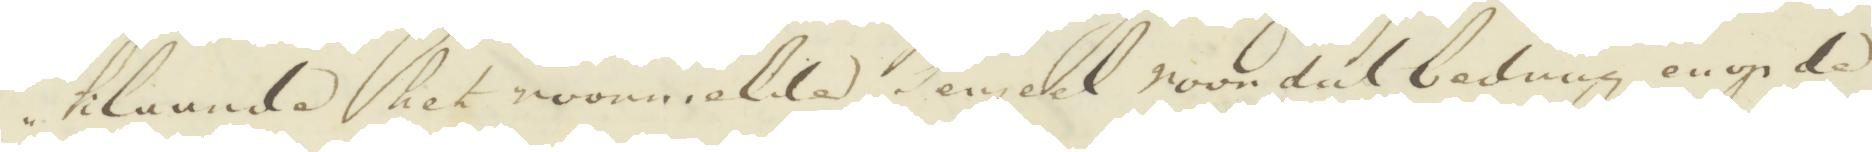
„klaarde het voormelde Perceel voor dat bedrag en op de
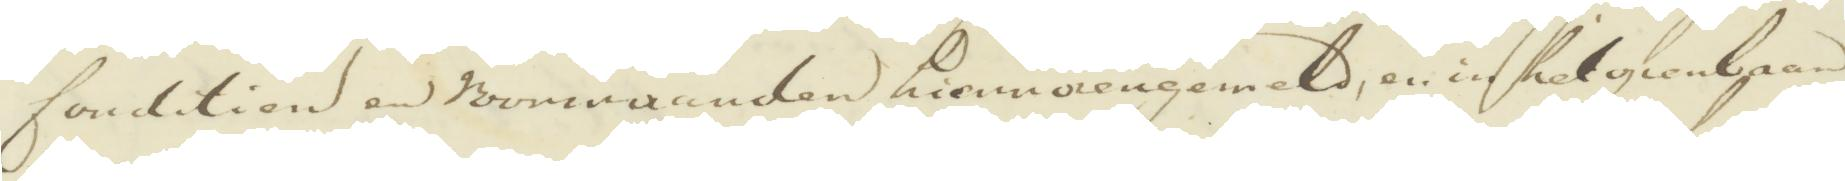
Conditien en voorwaarden hiervorengemeld, en in het openbaar
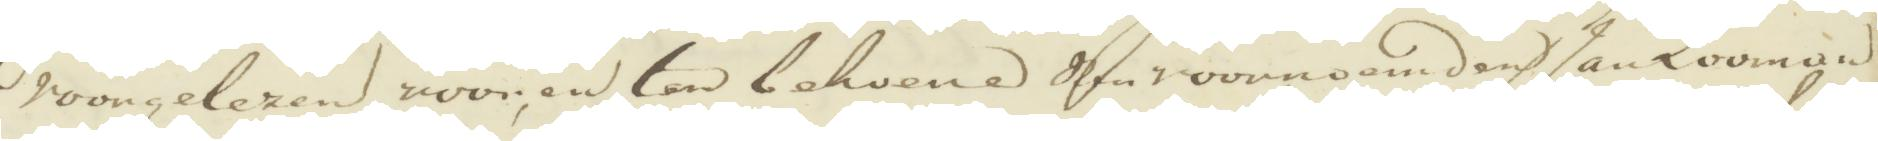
voorgelezen voor, en ten behoeve van voornoemden Jan Looman
